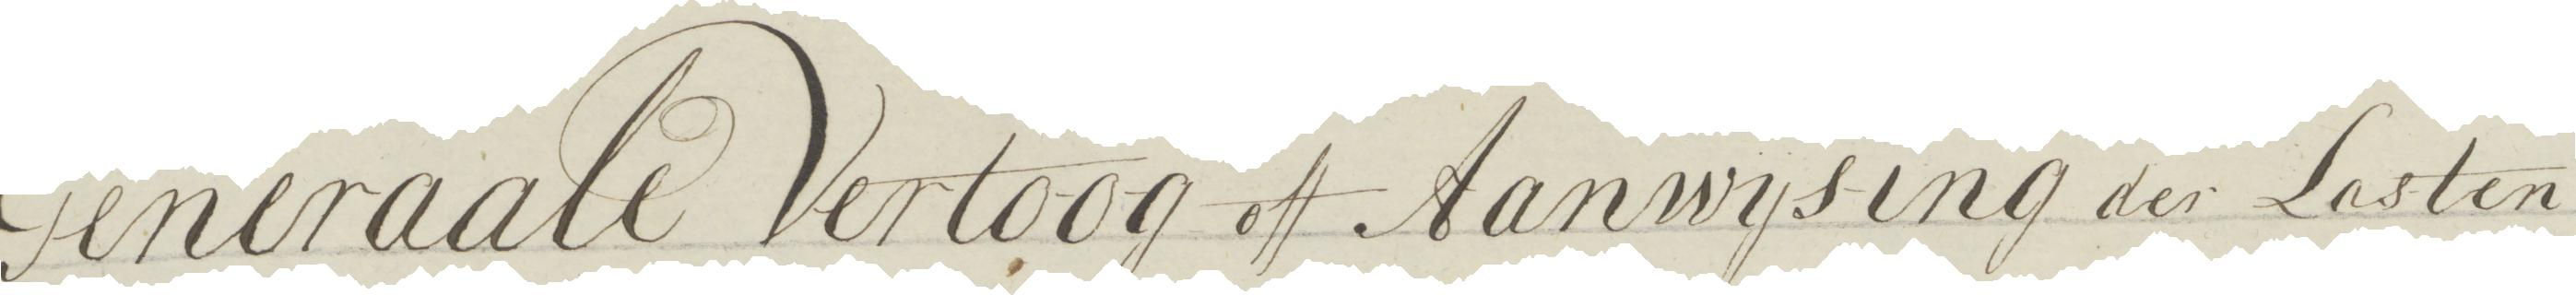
Generaale Vertoog off Aanwijsing der Lasten
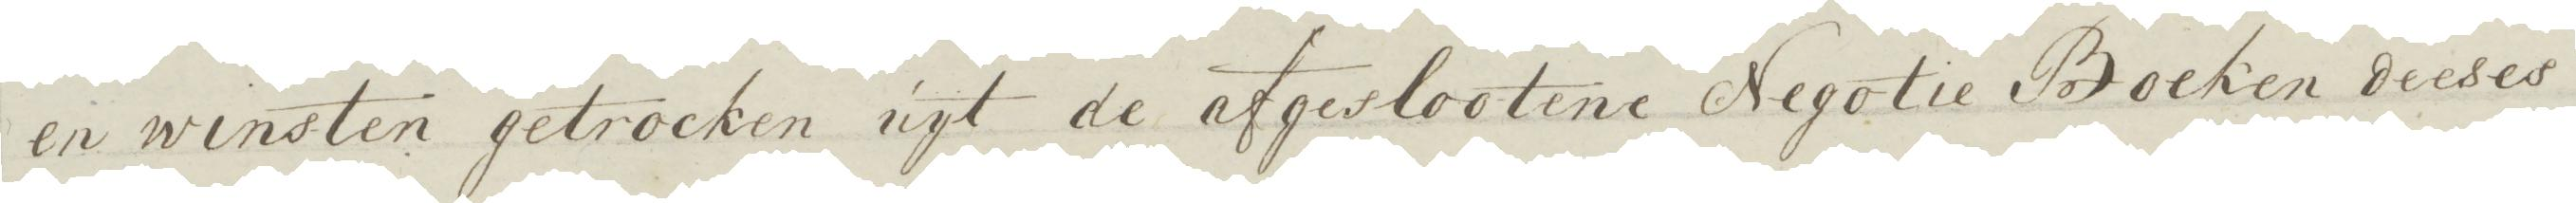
en winsten getrocken uijt de afgeslootene Negotie Boeken deeses
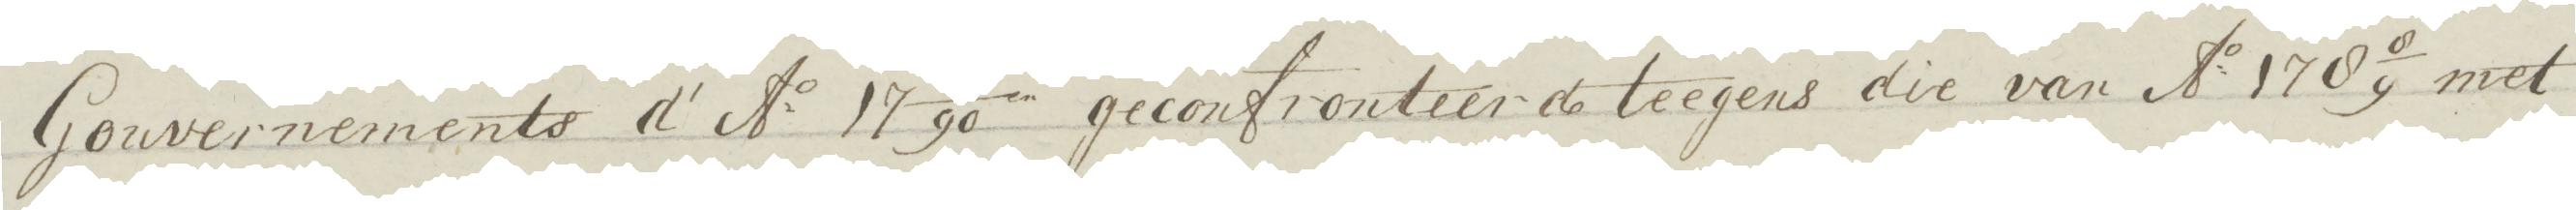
Gouvernements d' A=o 17 89/en90 geconfronteerd teegens die van A=o 178 8/9 met
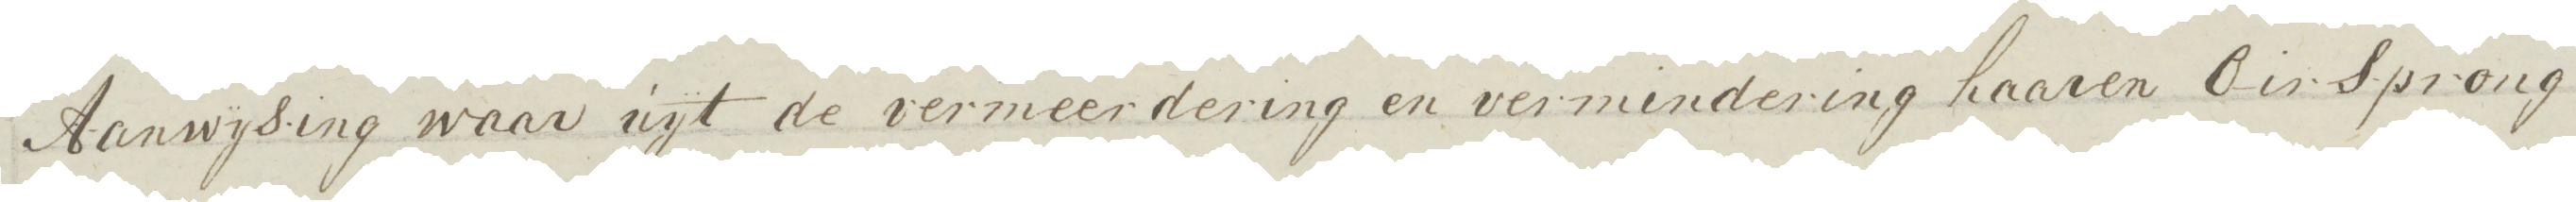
Aanwijsing waar uijt de vermeerdering en vermindering haaren Oirsprong
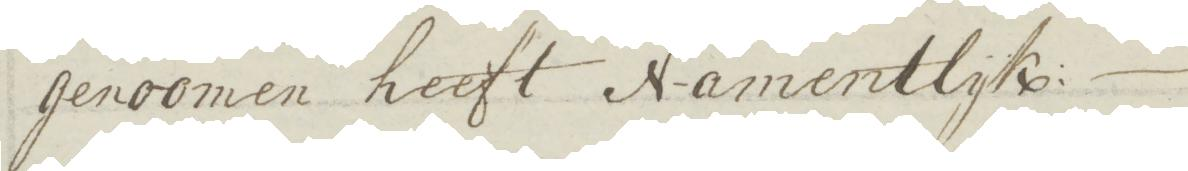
genoomen heeft Namentlijk:—
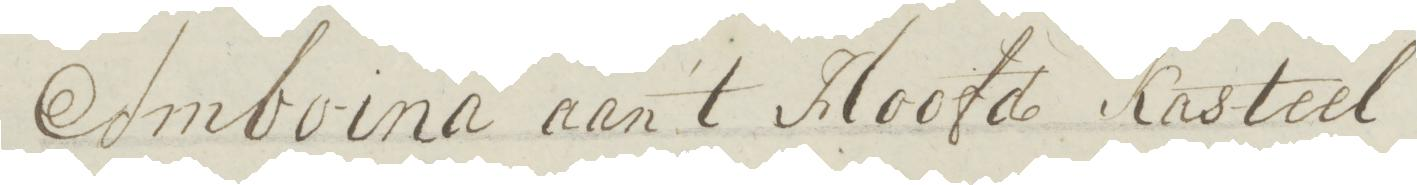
Amboina aan ’t Hoofd Kasteel
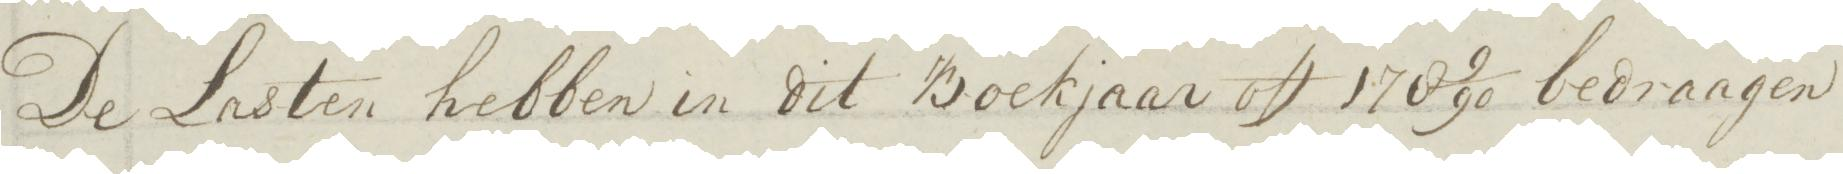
De Lasten hebben in dit Boekjaar off 178 9/90 bedraagen
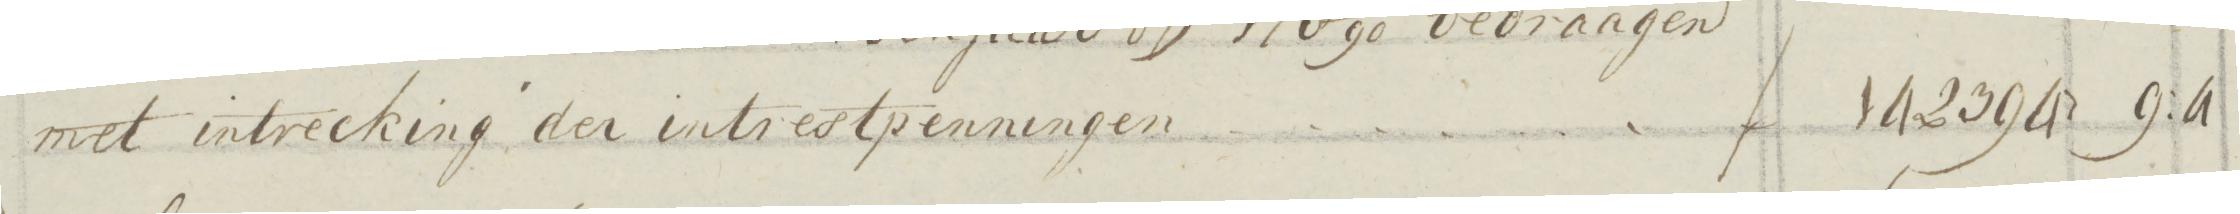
met intrecking der intrestpenningen - - - - - - f 142394: 9:4
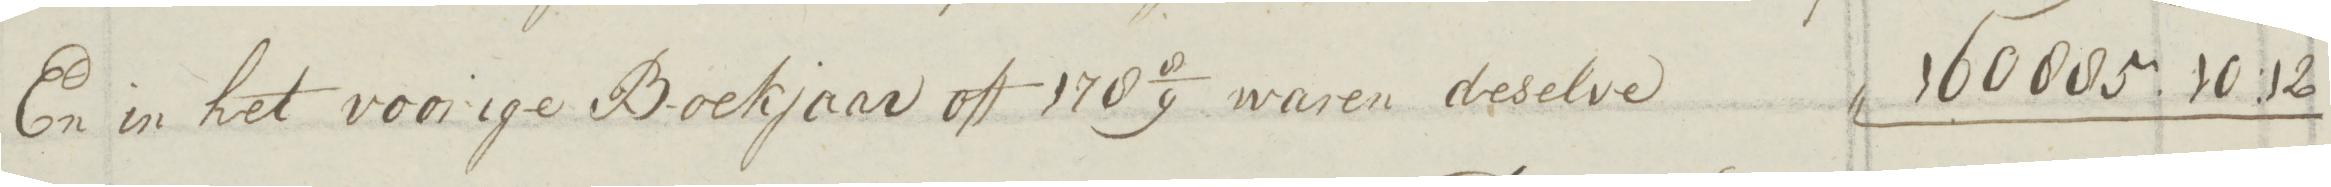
En in het voorige Boekjaar off 178 8/9 waren deselve „ 160885: 10:12
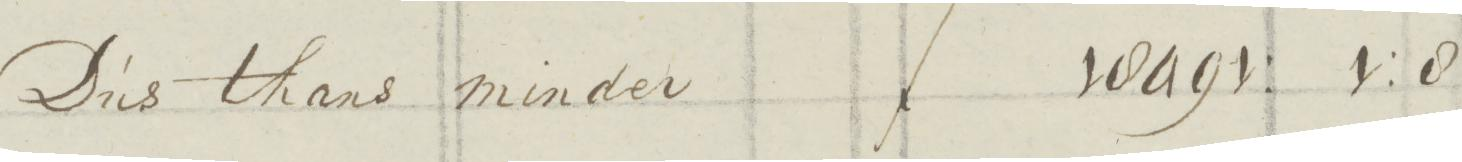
Dus thans minder ƒ 18491: 1:8
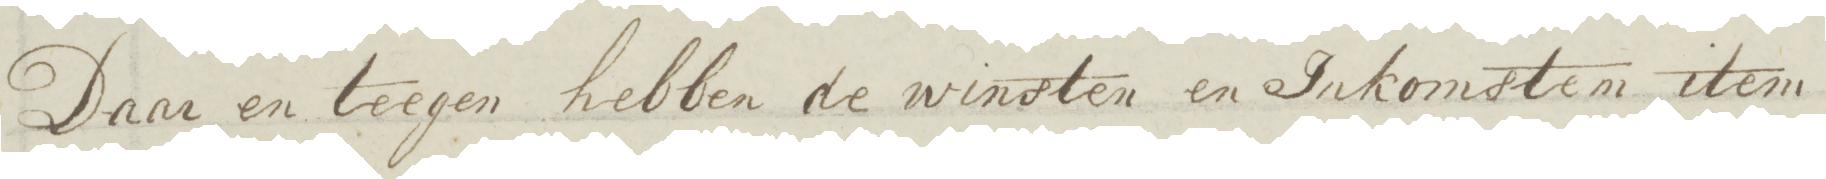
Daar en teegen hebben de winsten en Inkomstem item
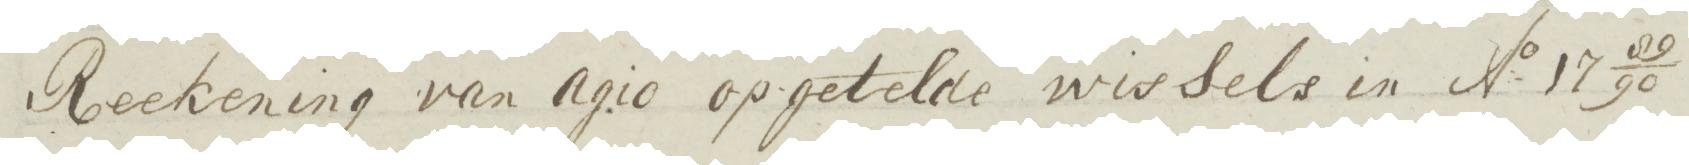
Reekening van agio opgetelde wissels in A=o 17 89/90
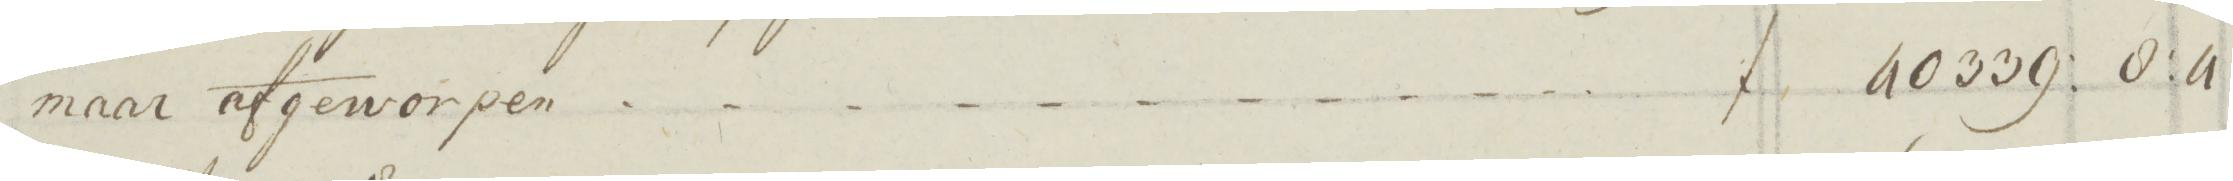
maar afgeworpen - - - - - - - - - - - - - - ƒ 40339: 8:4
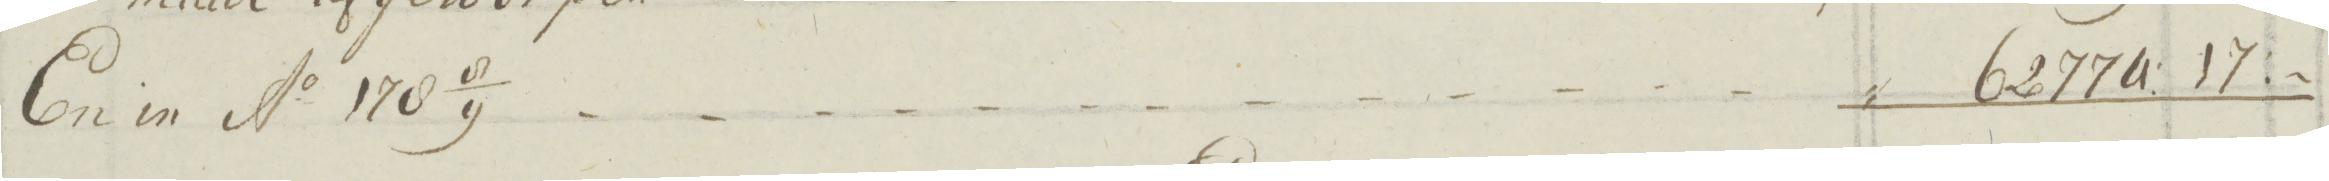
En in A=o 178 8/9 - - - - - - - - - - - - - „ 62774: 17:-
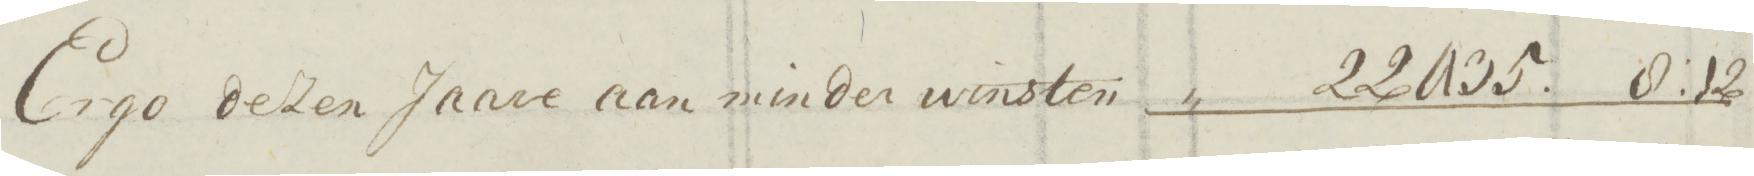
Ergo dezen Jaare aan minder winsten „ 23435: 8:12
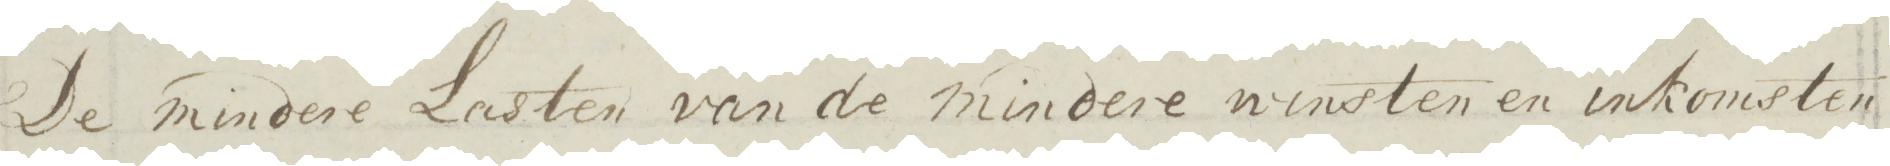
De mindere Lasten van de mindere winsten en inkomsten
